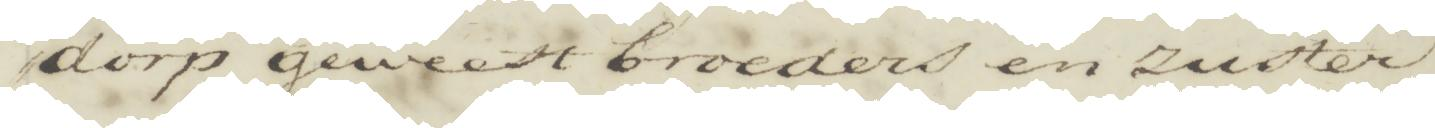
„dorp geweest broeders en zuster
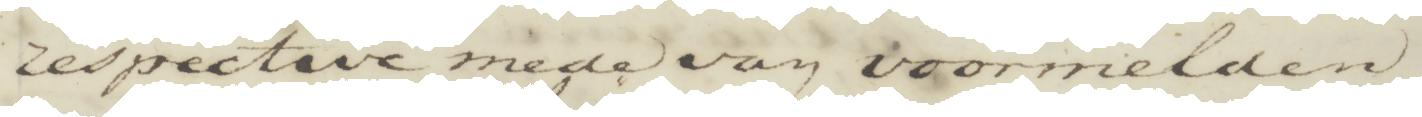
respective mede van voormelden
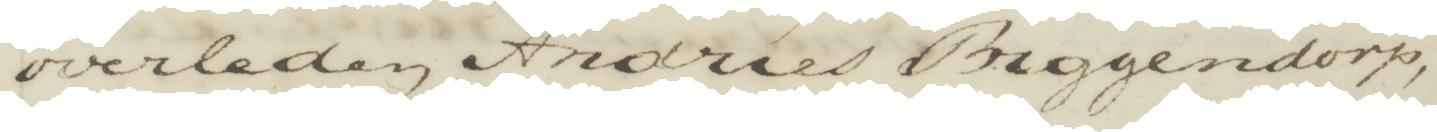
overleden Andries Biggendorp,
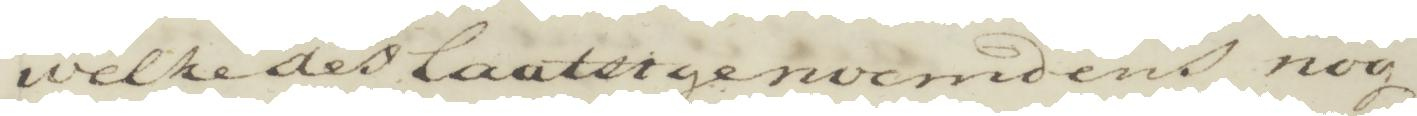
welke des laatstgenoemdens nog
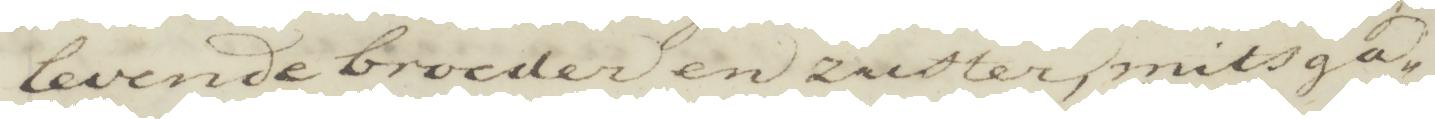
levende broeder en zuster, mitsga„
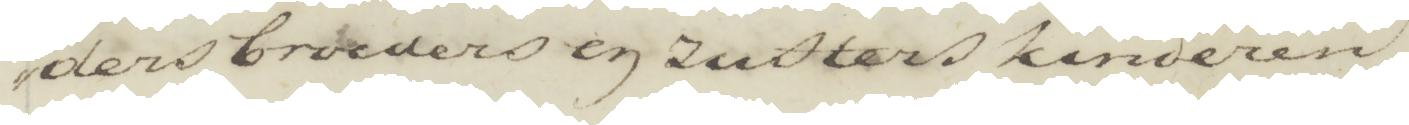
„ders broeders en zusters kinderen
